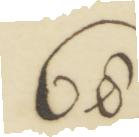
68.
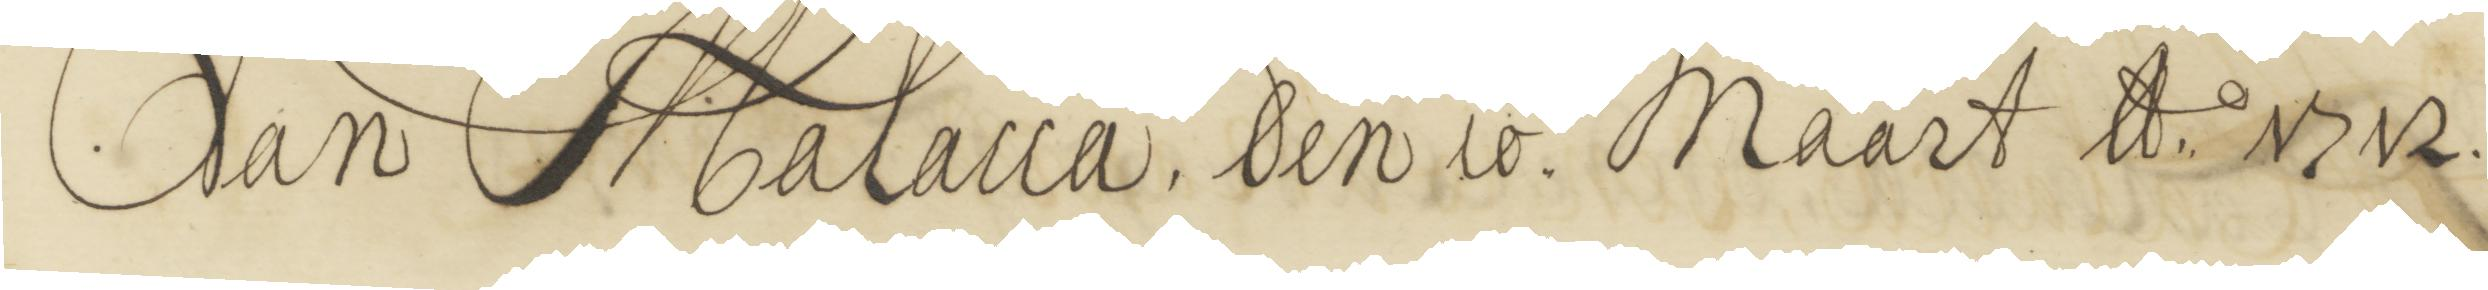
Van Malacca, den 10„' Maart A„o 1712.
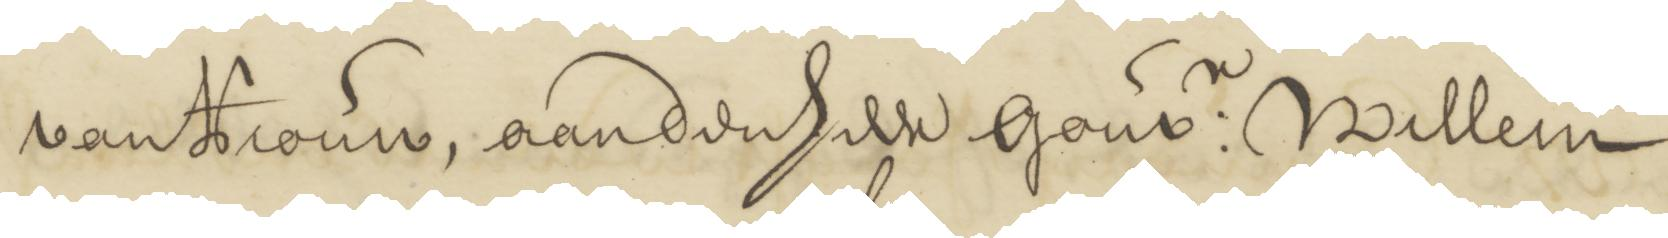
van Riouw, aan den heer gouv:r Willem
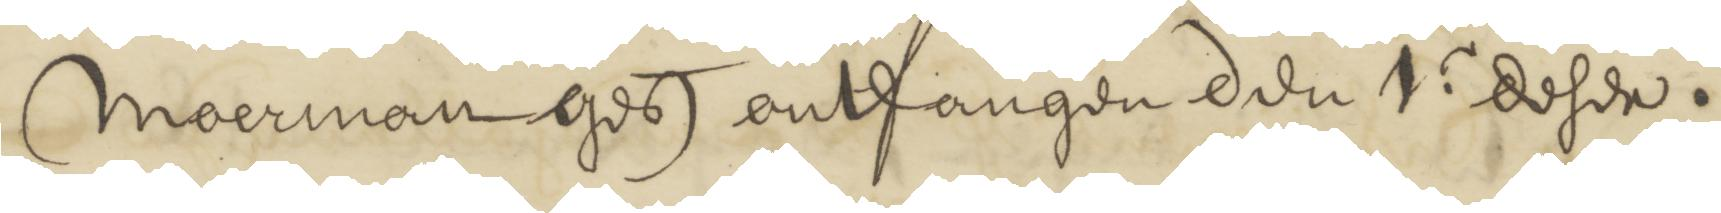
moerman ges: ontfangen den 1.' deser.
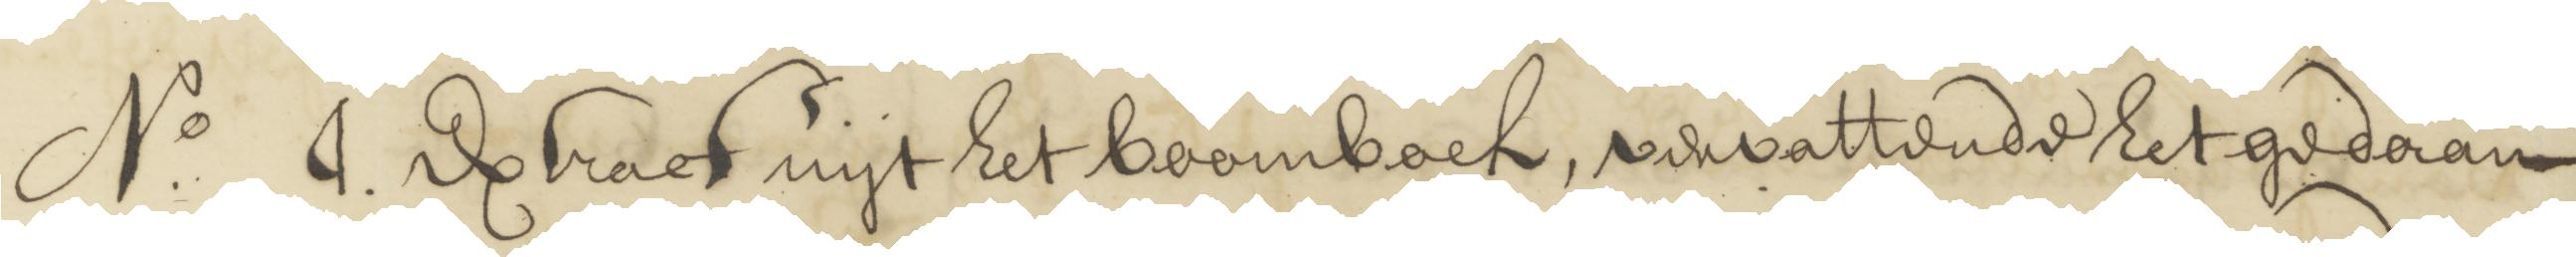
N:o 4. Extract uijt het boomboek, vervattende het gedaan
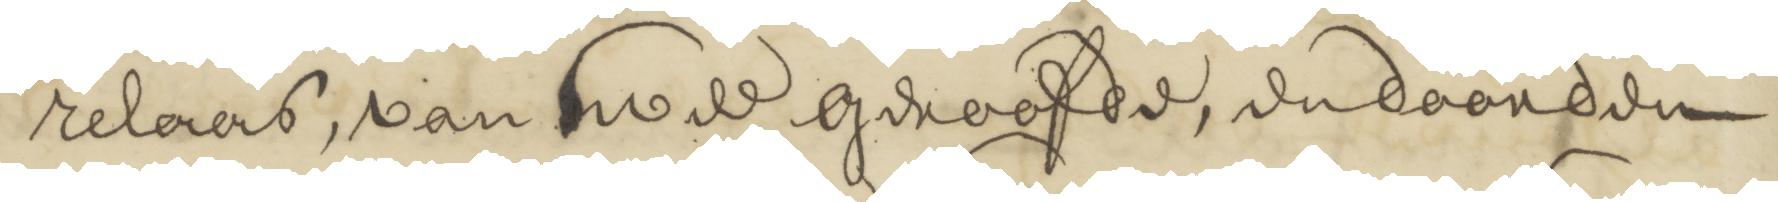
relaes, van twee geroofde, en door den
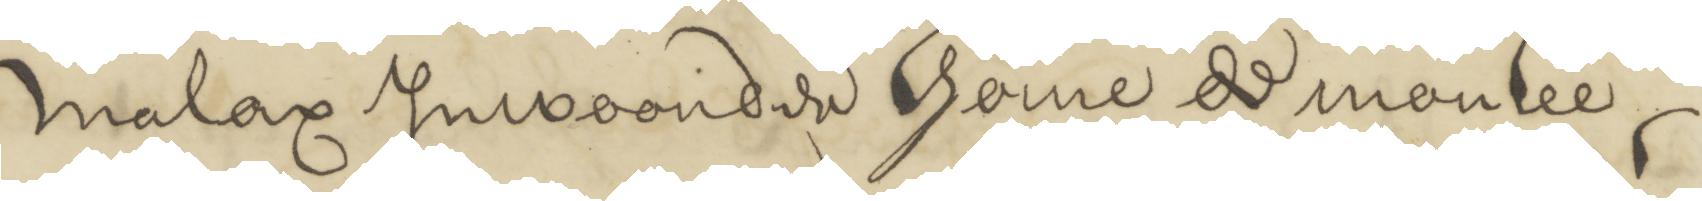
malax Jnwoonder thome de montee
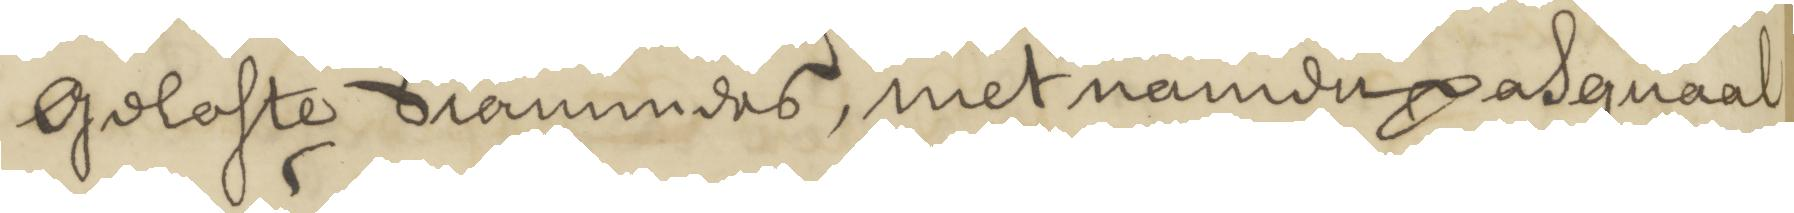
geloste Siammers, met namen pasquaal
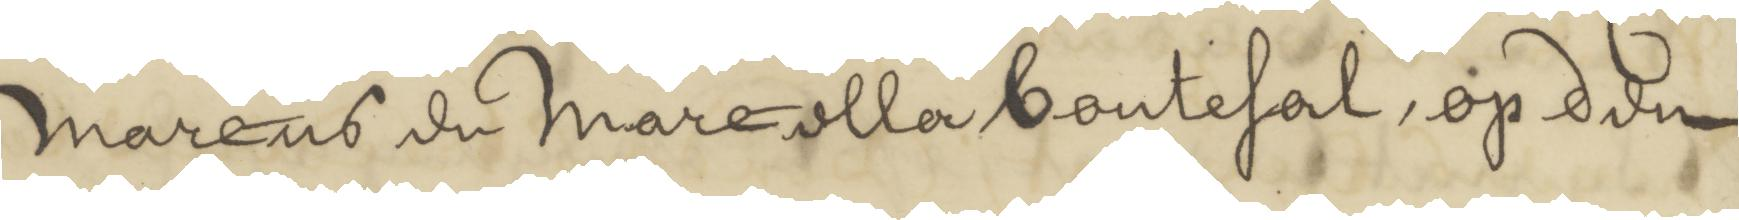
Marcus en Marcella bontesal, op den
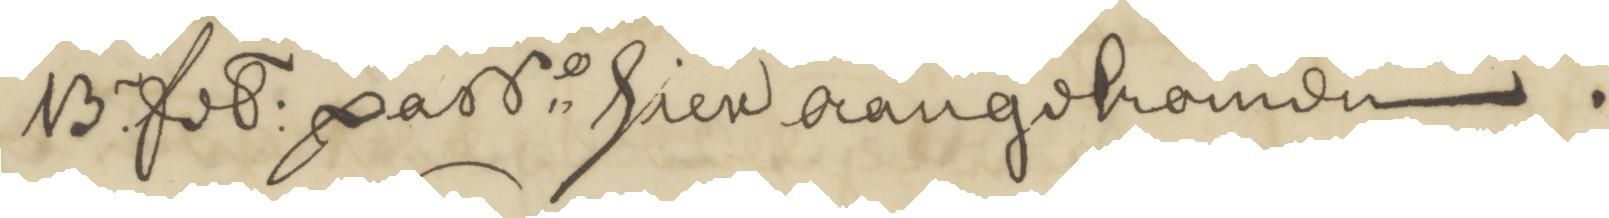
13. feb: pass„o hier aangekomen.
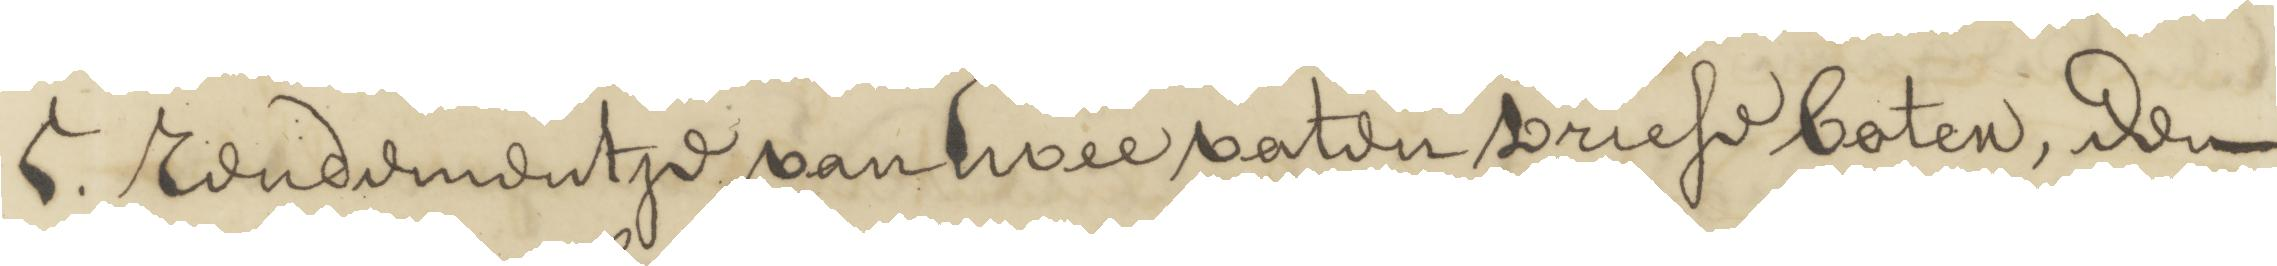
5. rendementje van twee vaten vriese boter, Een
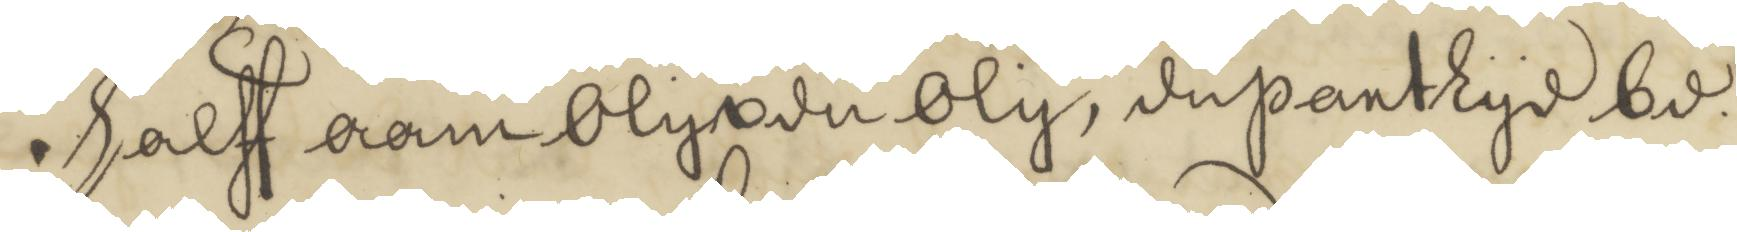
.halff aam olijven olij, en parthije be.
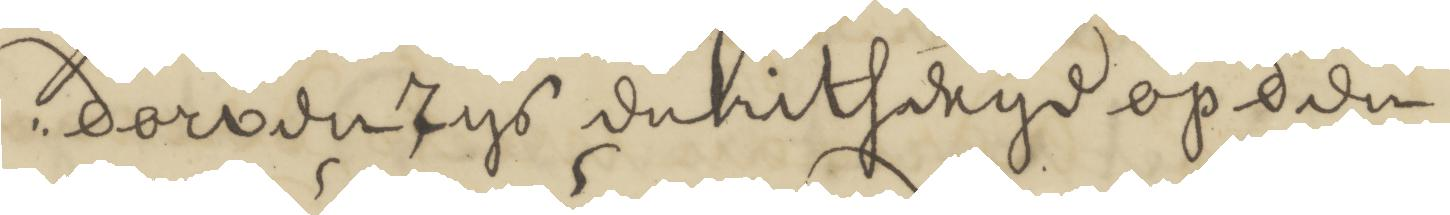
„dorven rijs en kitserije op den
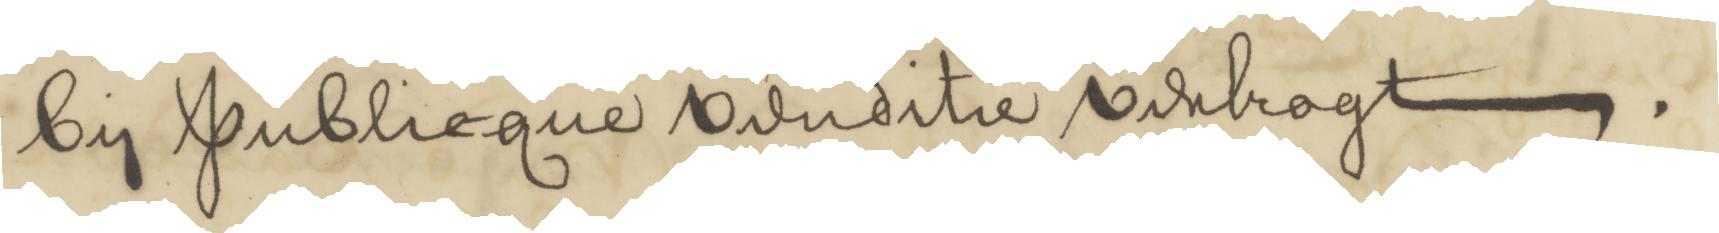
bij publicque venditie verkogt.
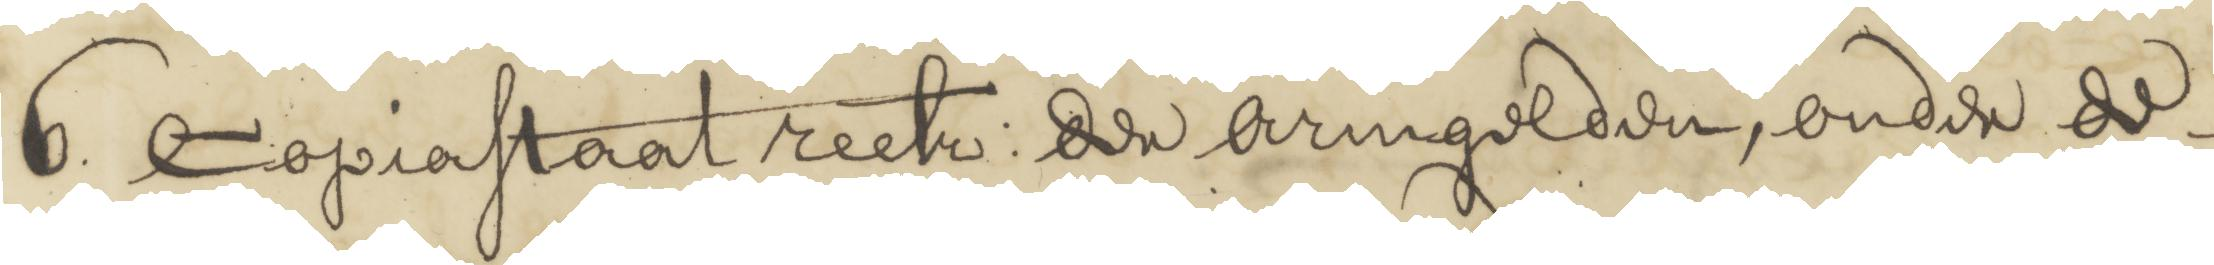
6. Copiastaat reek: der armgelden, onder de
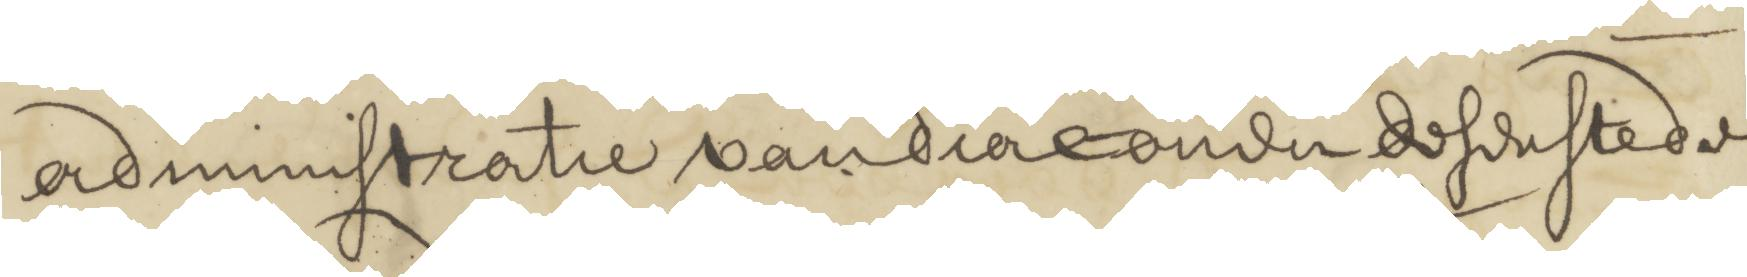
administratie van diaconen deserstede
